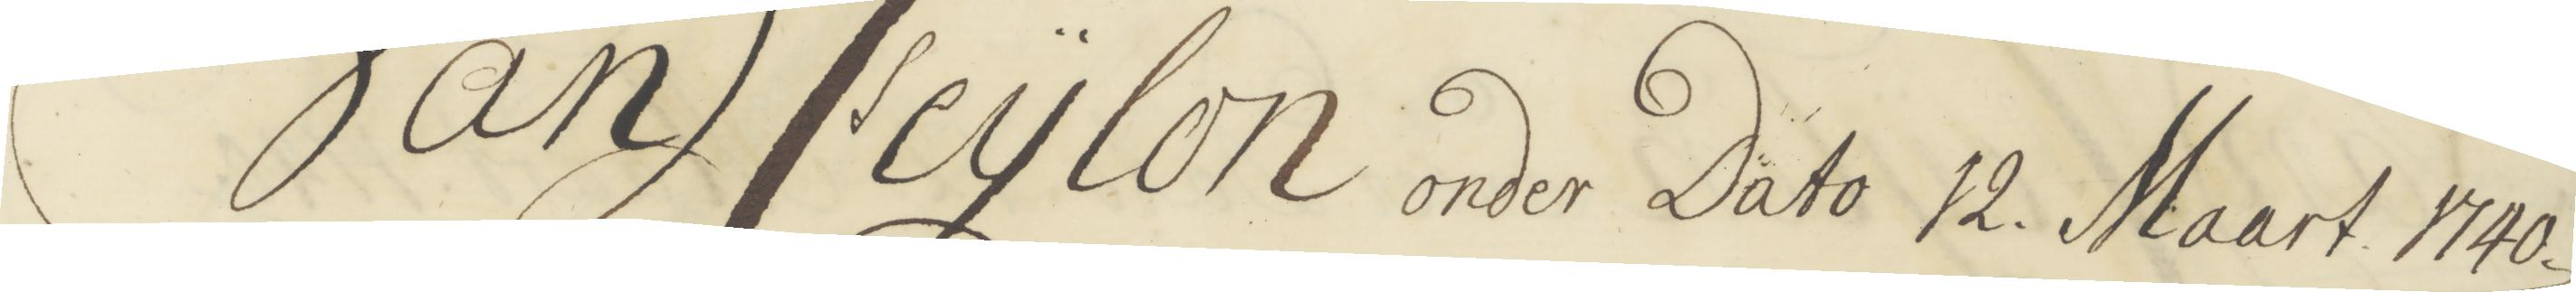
Van Ceijlon onder Dato 12. Maart 1740.
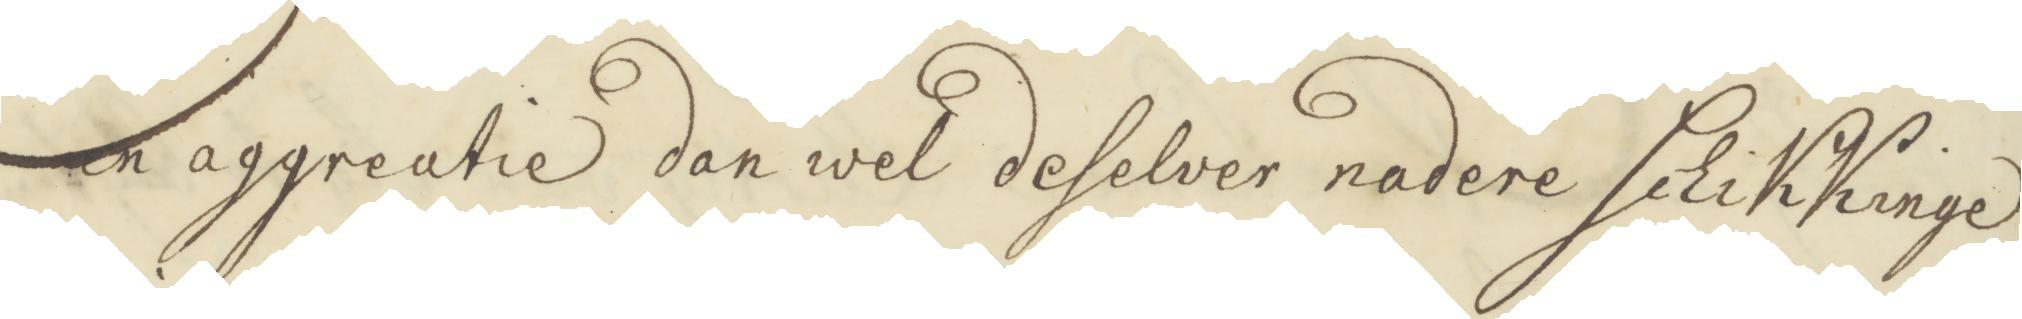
en aggreatie dan wel deselver nadere schikkinge
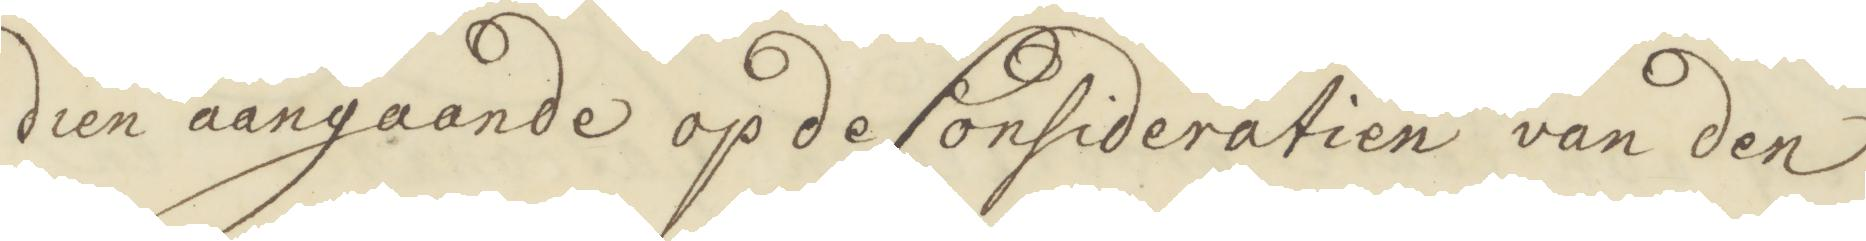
dien aangaande op de Consideratien van den
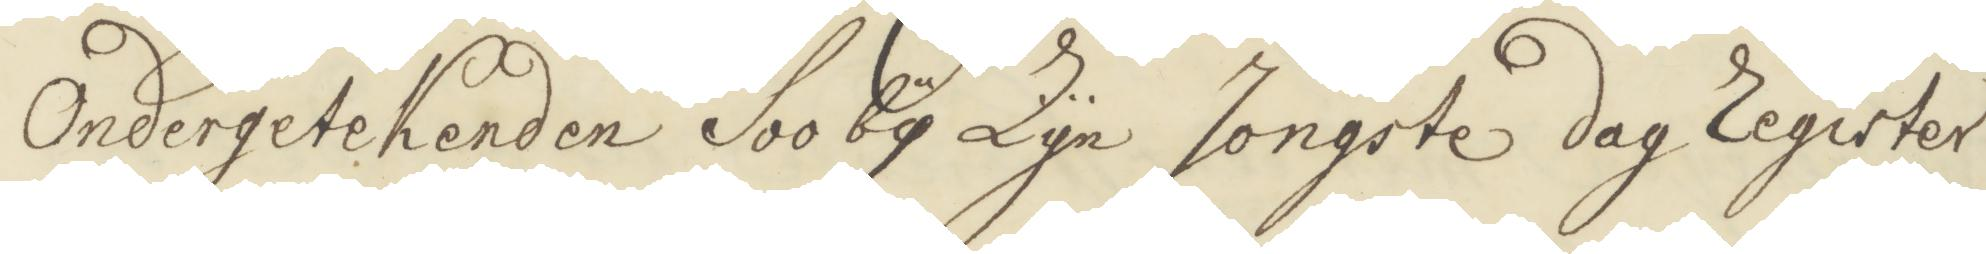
Ondergetekenden soo bij zijn Jongste dag register
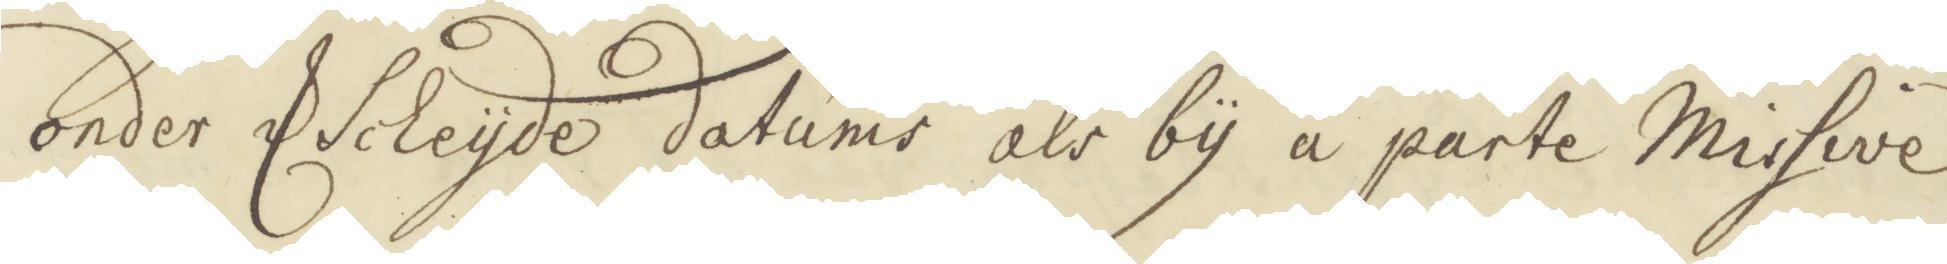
onder verscheijde datums als bij à parte missive
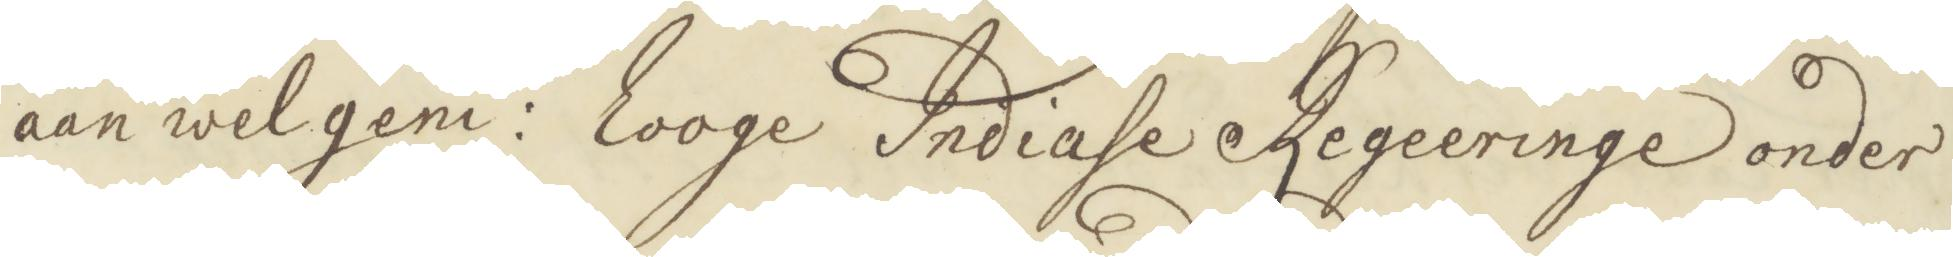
aan wel gem: hooge Indiase Regeeringe onder
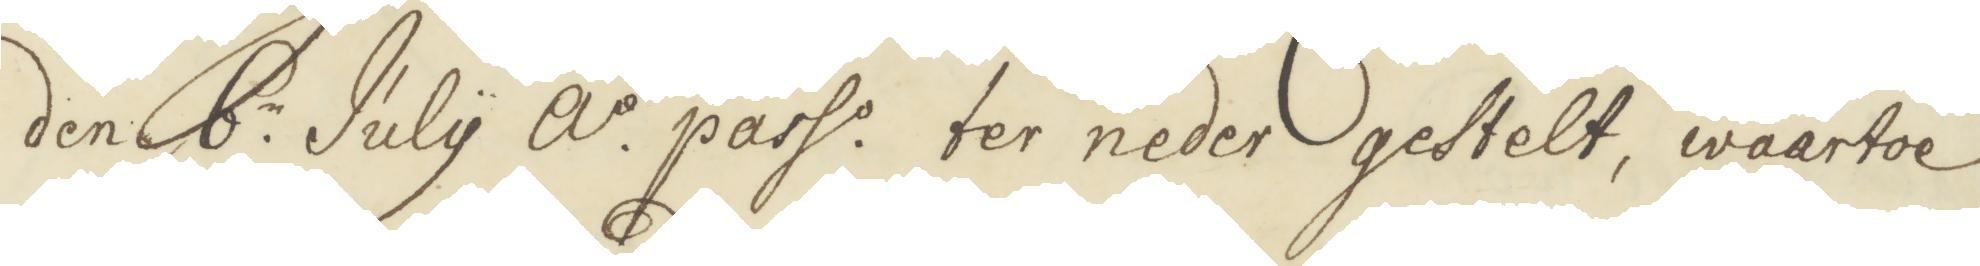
den 6:n Julij A.o pass.o ter neder gestelt, waartoe
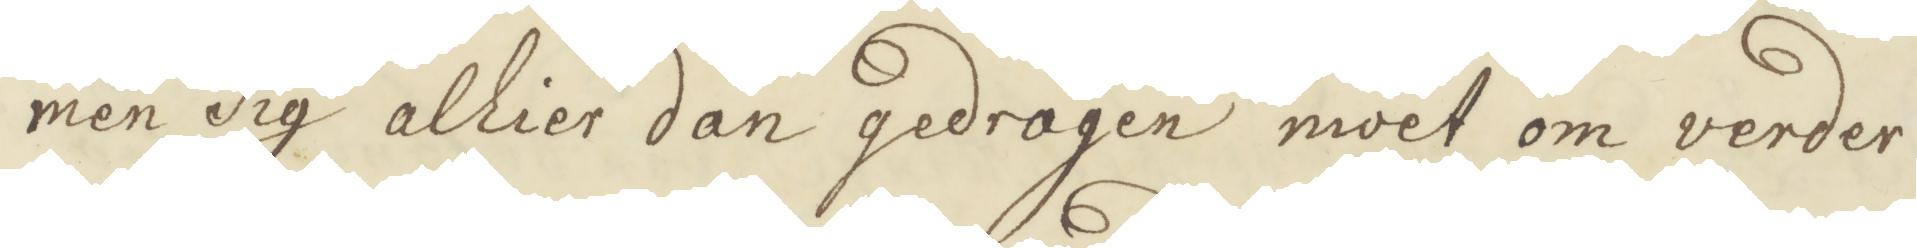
men sig alhier dan gedragen moet om verder
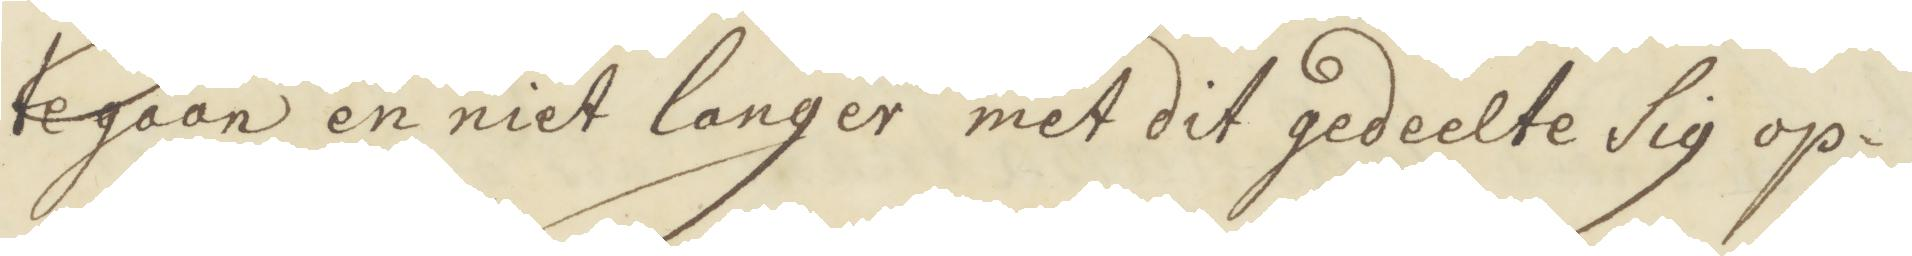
te gaan en niet langer met dit gedeelte sig op„
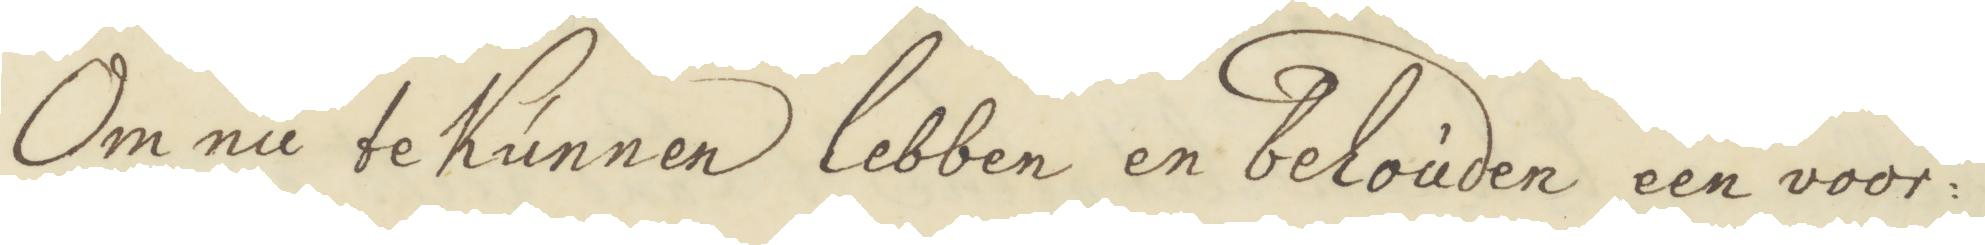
Om nu te kunnen hebben en behouden een voor:
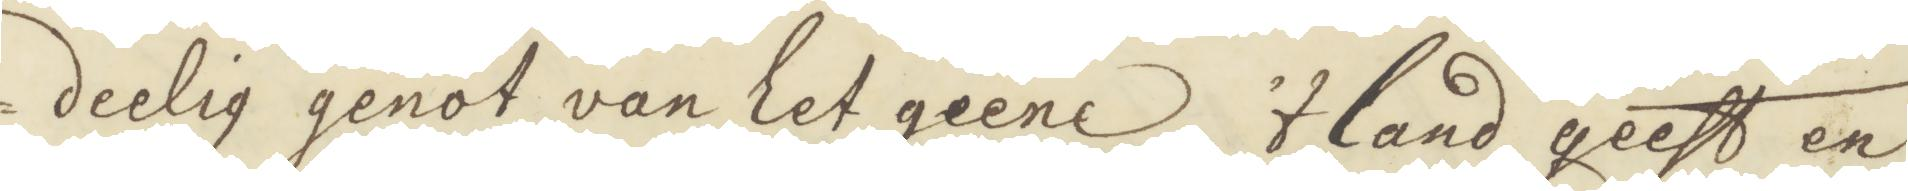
=deelig genot van het geene ’t land geeft en
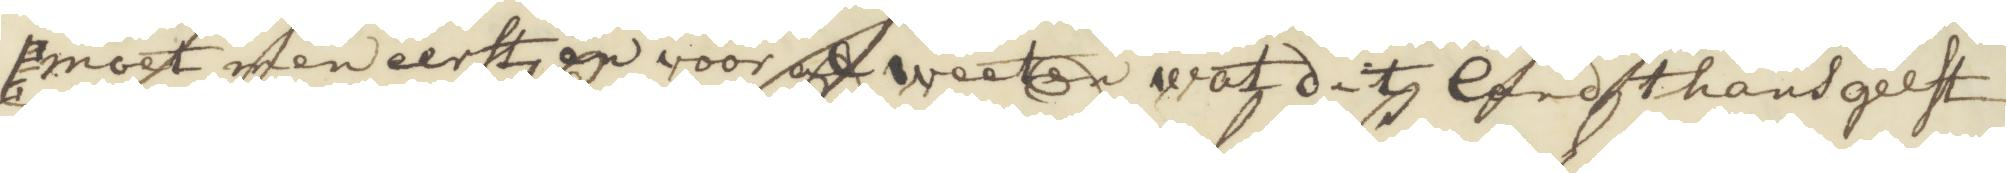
[moet men eerst en voor al weeten wat dit land thans geeft
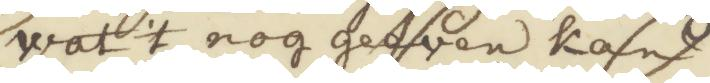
wat ’t nog geeven kan
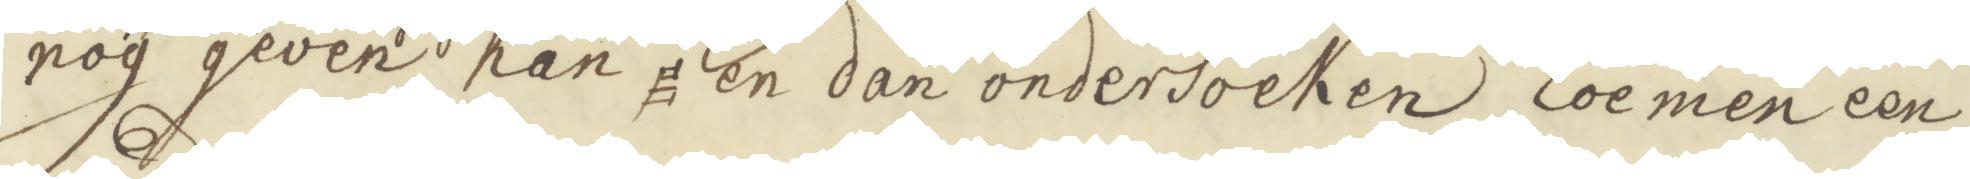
nog geven kan ] en dan ondersoeken hoe men een
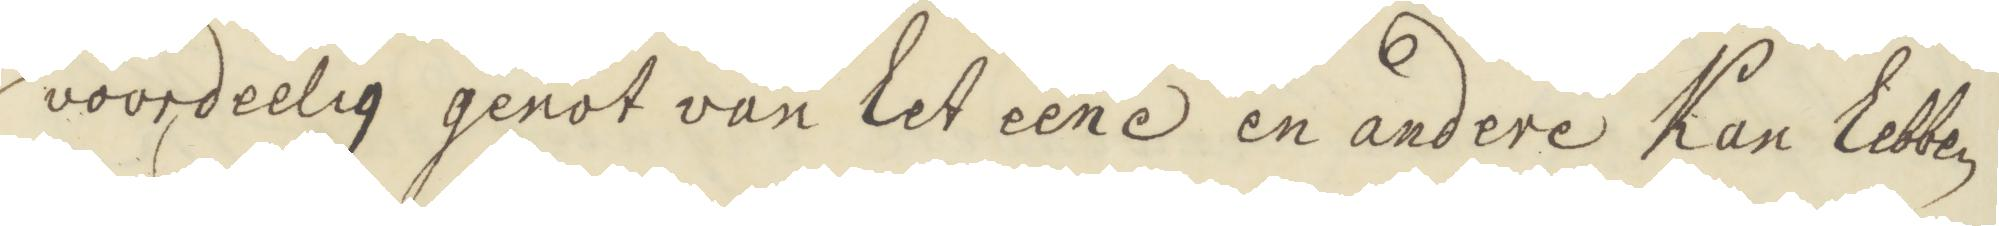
voordeelig genot van het eene en andere kan hebben
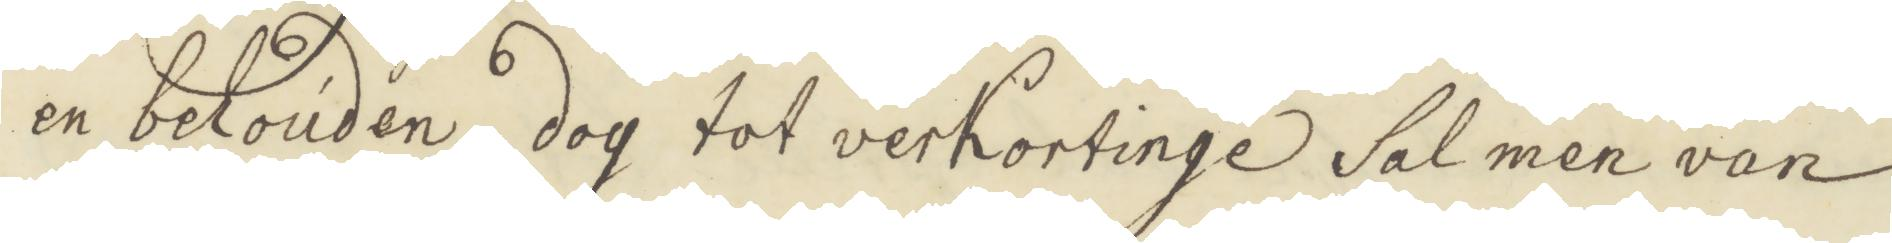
en behouden, dog tot verkortinge sal men van
